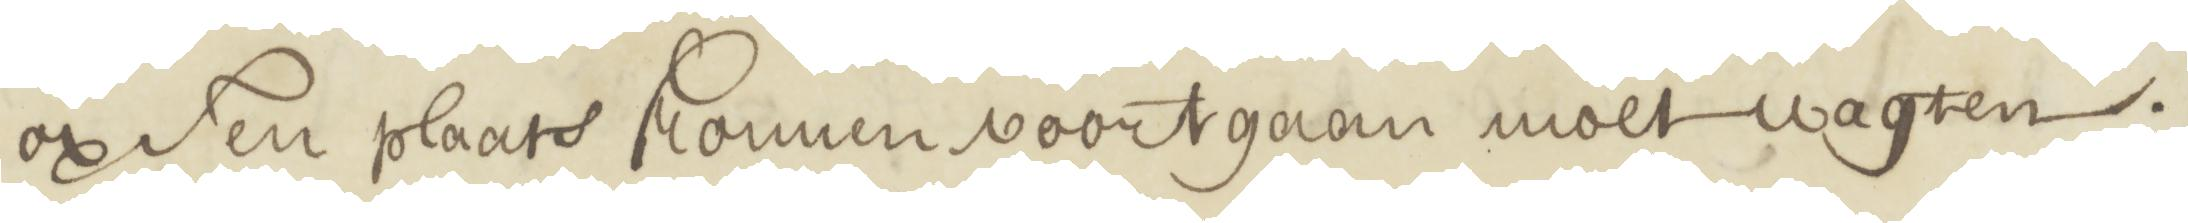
op Een plaats konnen voortgaan moet wagten,.
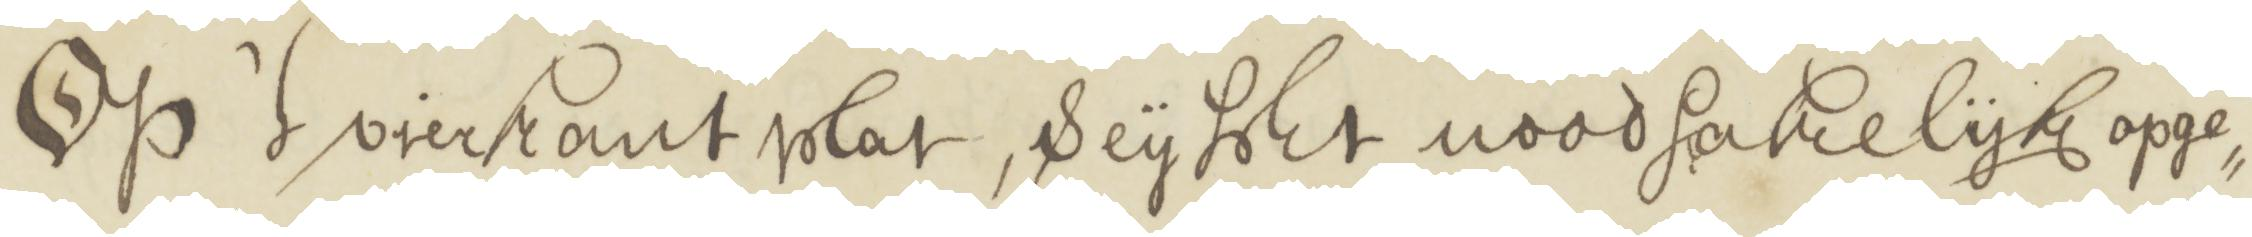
Op 't vierkant plat, vereijscht noodsakelijk opge„
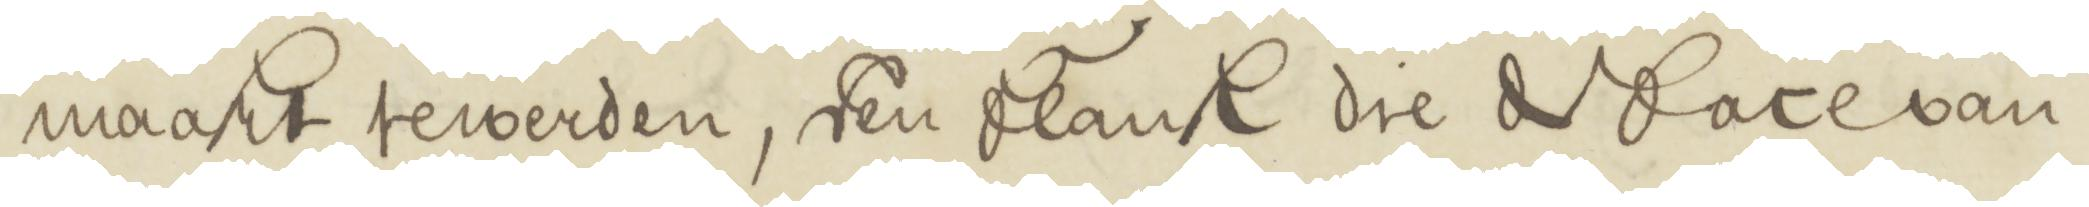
maakt tewerden, Een flank die de face van
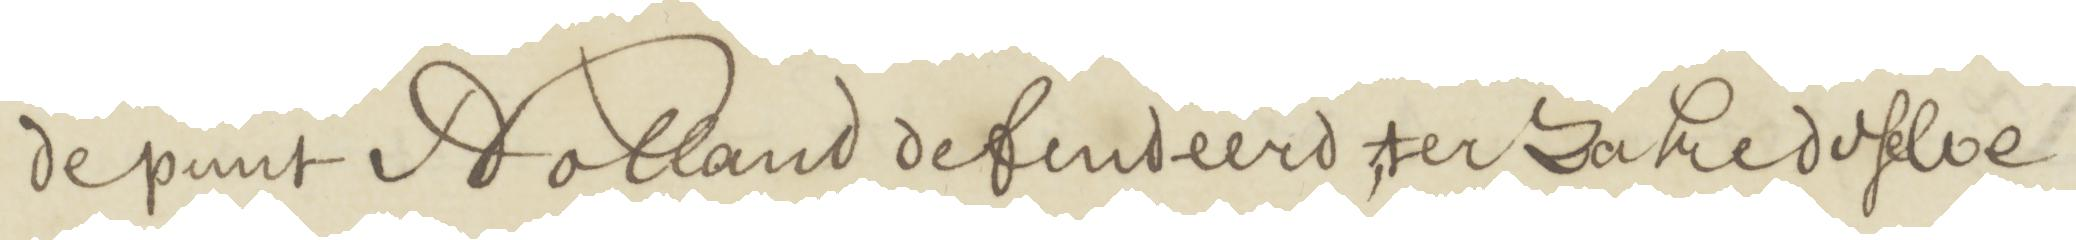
de punt Holland defendeerd, ter zake deselve
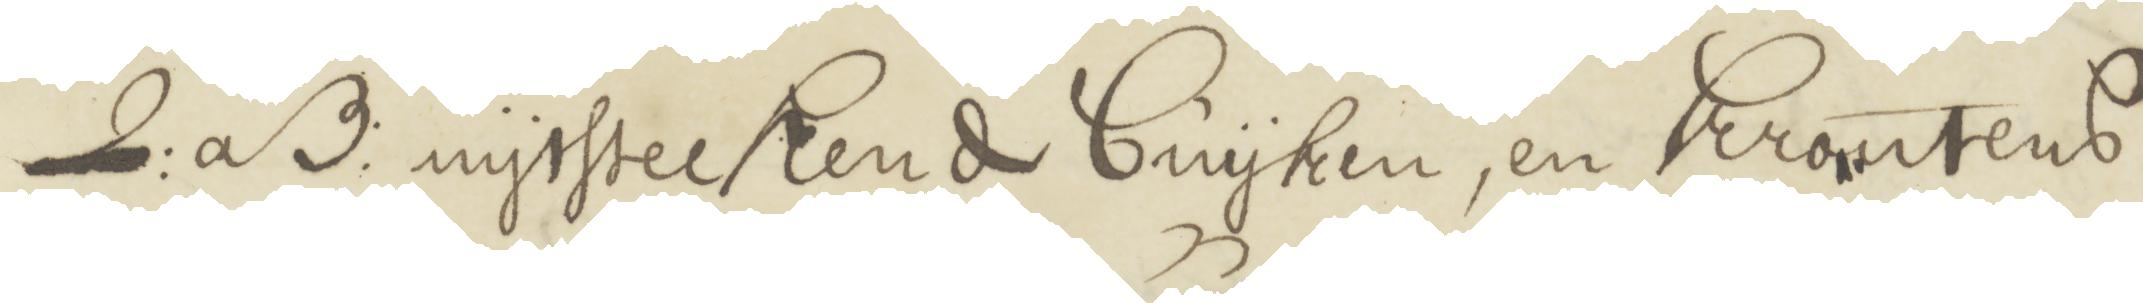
2: a 3: uijtsteekende buijken, en kromtens
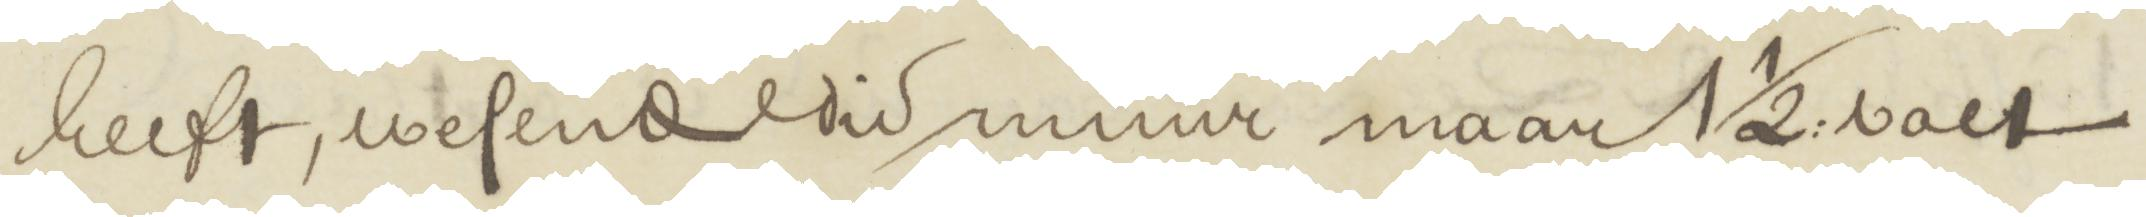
heeft, wesende die muur maar 1½: voet
